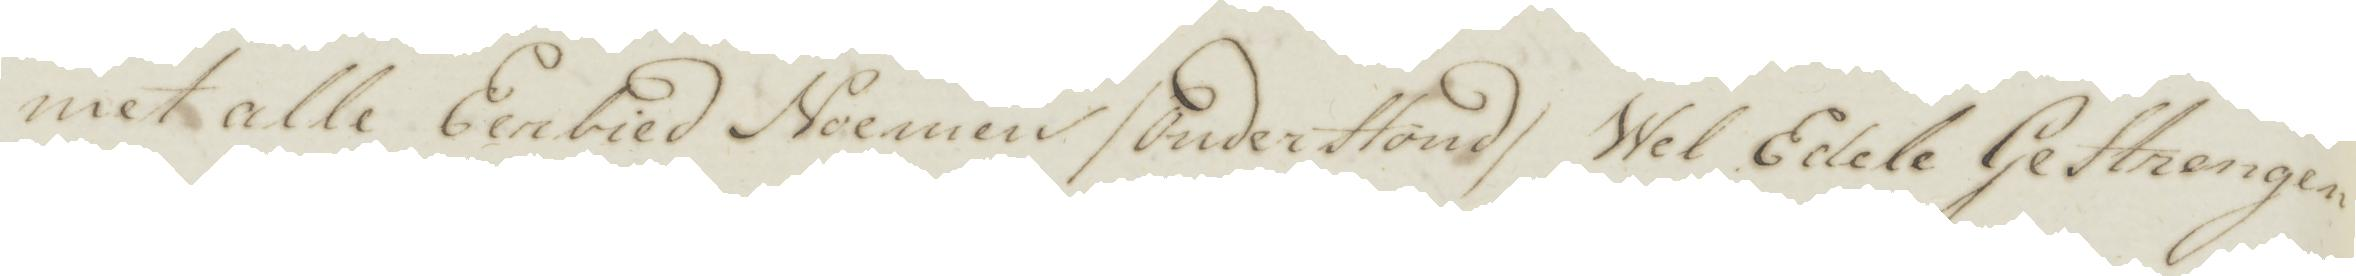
met alle Eerbied Noemen /onder stond/ Wel Edele Gestrengen
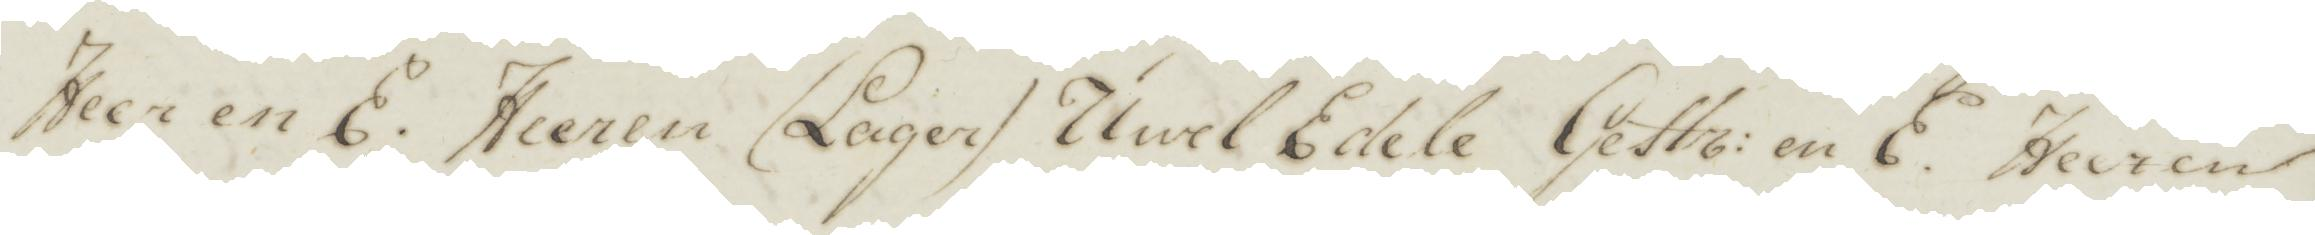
Heer en E. Heeren (Lager/ U wel Edele Gestr: en E. Heeren
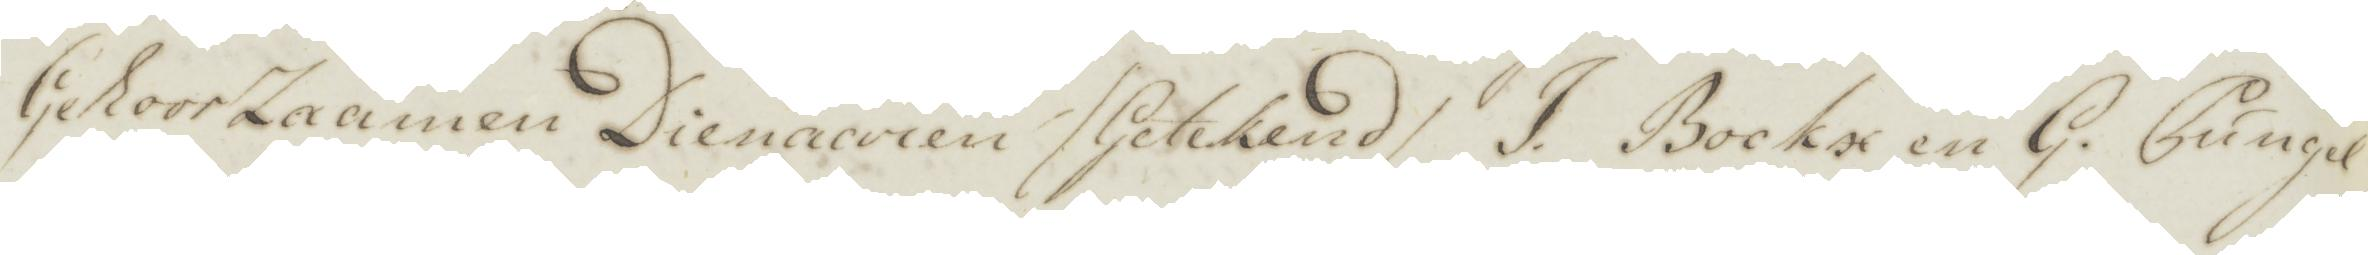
Gehoorzaamen Dienaaren /Getekend / I. Boekx en G. Pungel
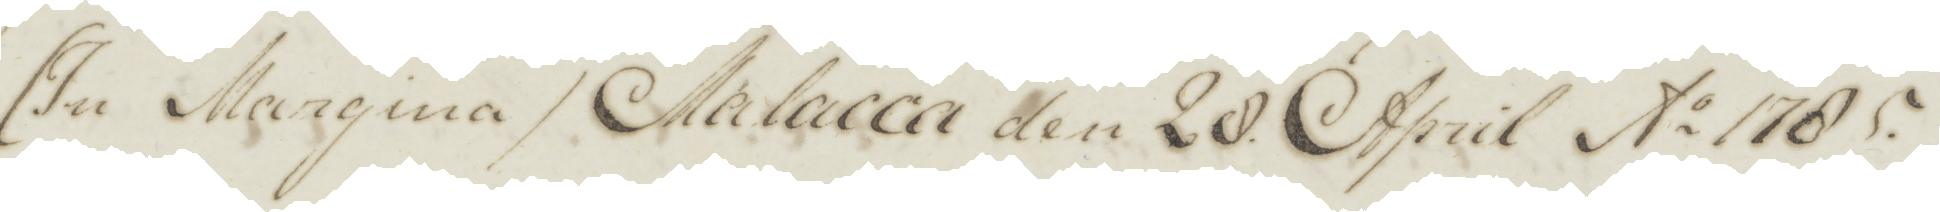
( In Margina/ Malacca den 28. April A=o 1785.
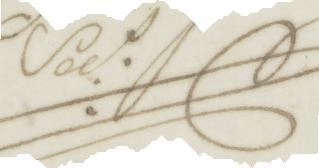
Sec:s
